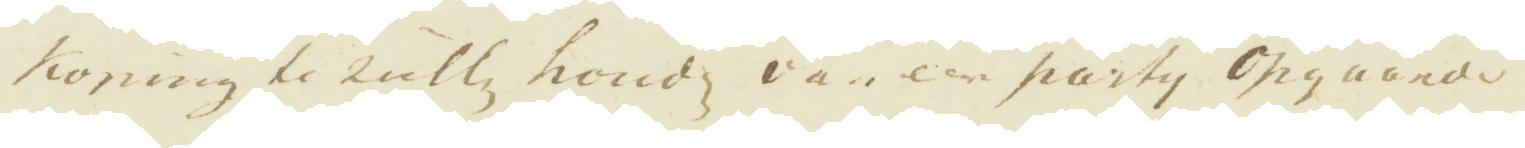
koping te zullen houden van een partij Opgaande
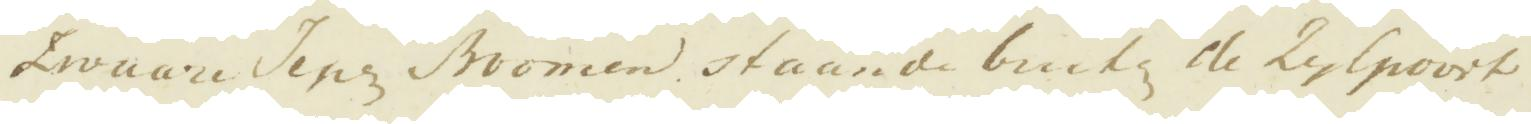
zwaare Iepen Boomen, staande buiten de Zylpoort
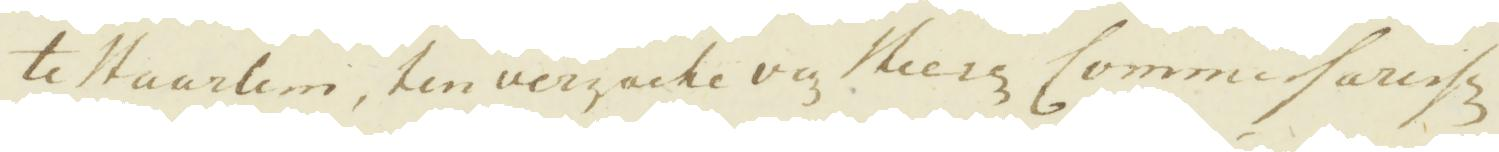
te Haarlem, ten verzoeke van Heeren Commissarissen
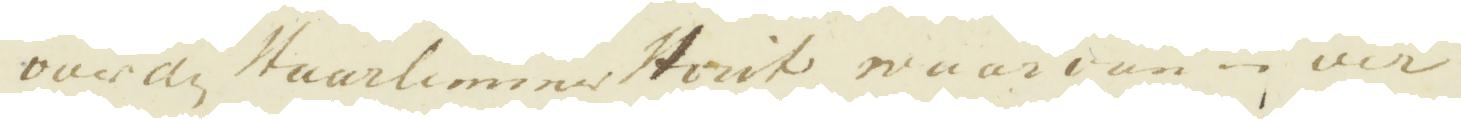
over den Haarlemmer Hout waarvan is ver
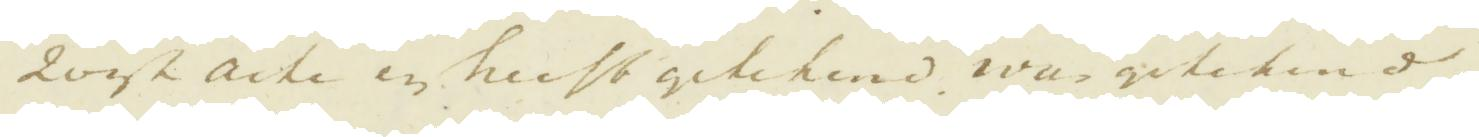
zogt acte en heeft getekend, was getekend
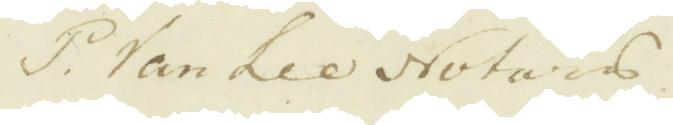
P. Van Lee Notaris
